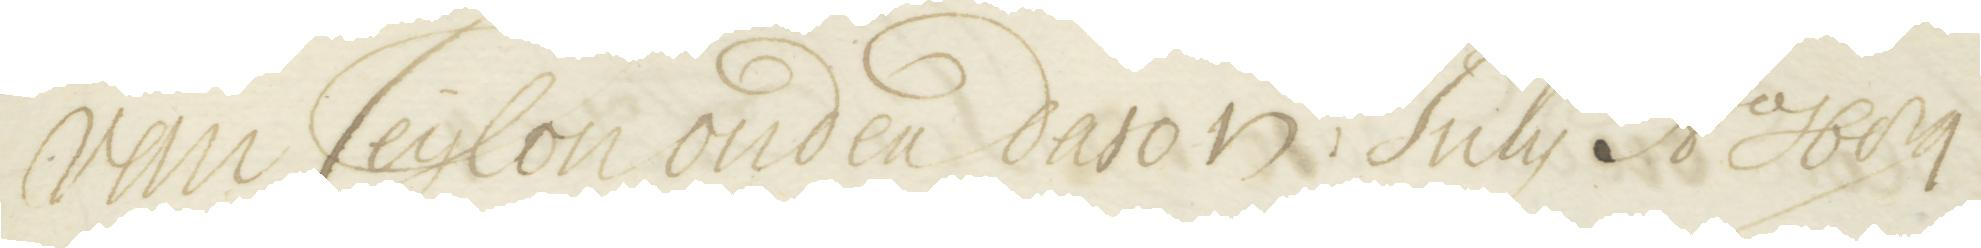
van Ceijlon onder dato 17:' Iulij Ao 1684
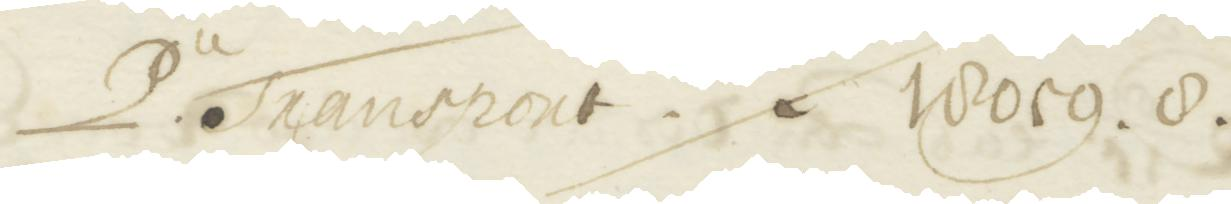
P.r Transport - ƒ 18059. 8
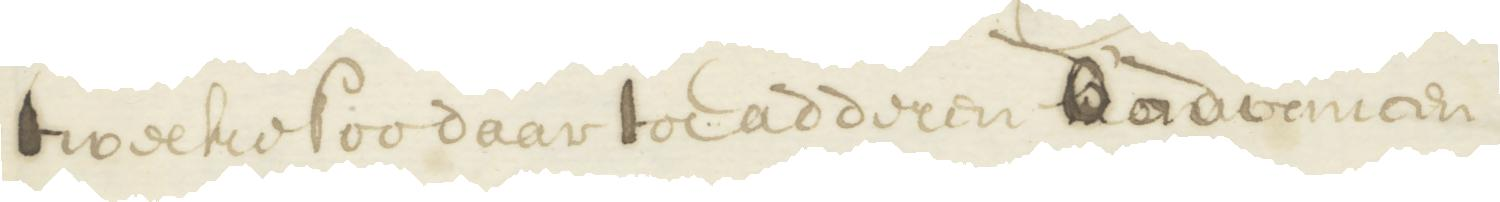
twelke soo daar toe adderen dadvemoen
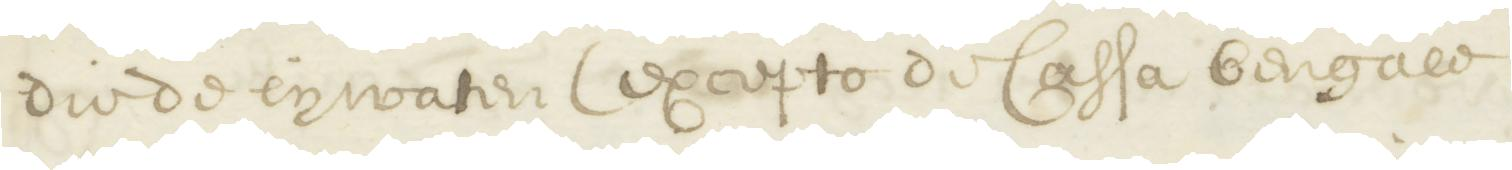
die de lijwaten (excepto de Cassa bengale
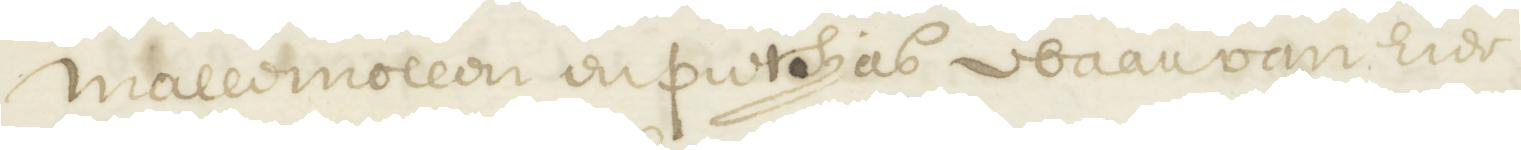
mallemollen en pietchas waarvan hier
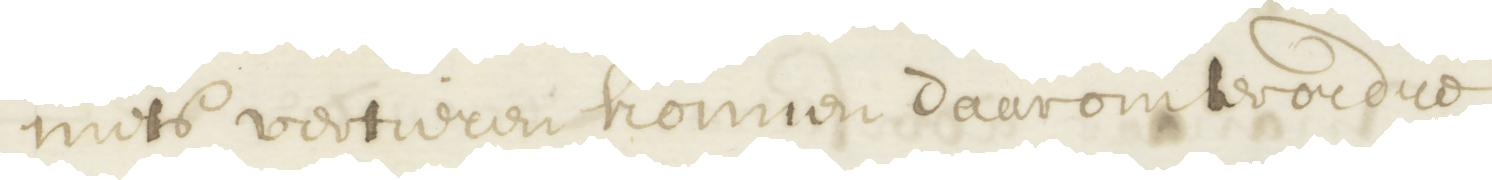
niets vertieren konnen daarom ter ordre
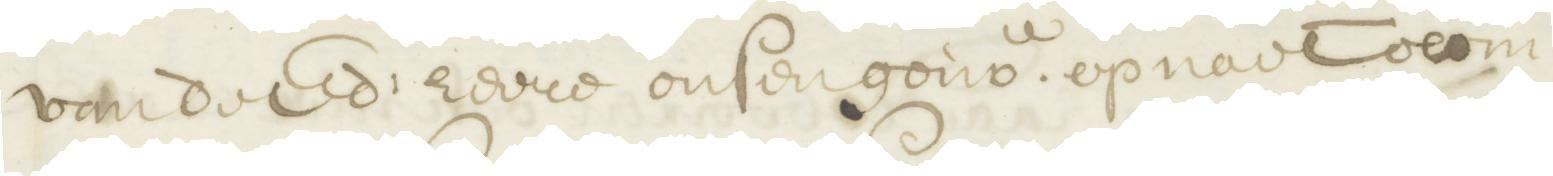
van de Ed: heere onsen gouv.e op nae Colom
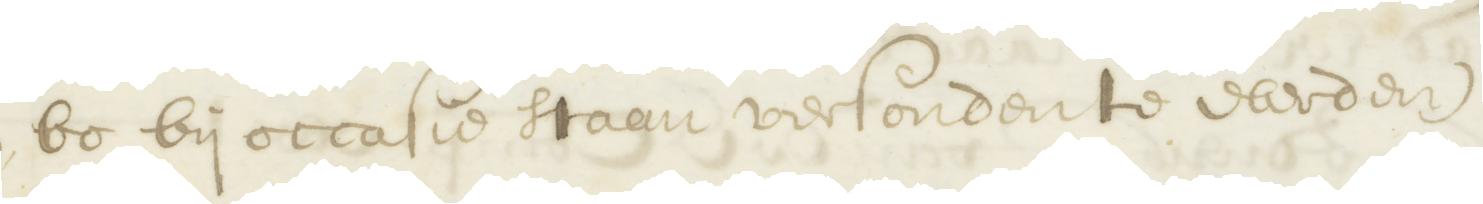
„bo bij occasie staan versonden te werden)
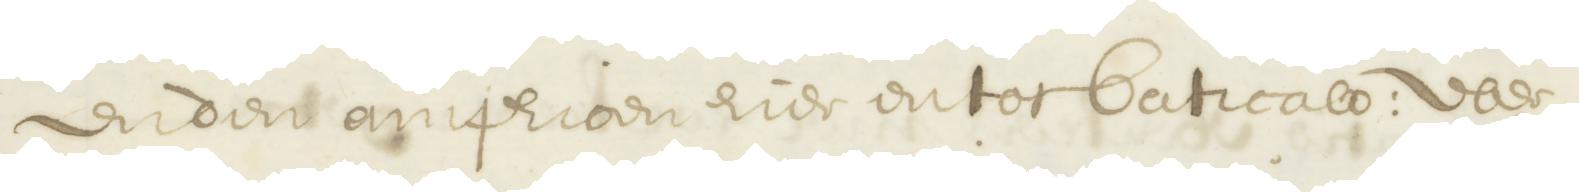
en den amphioen hier en tot baticalo: wer
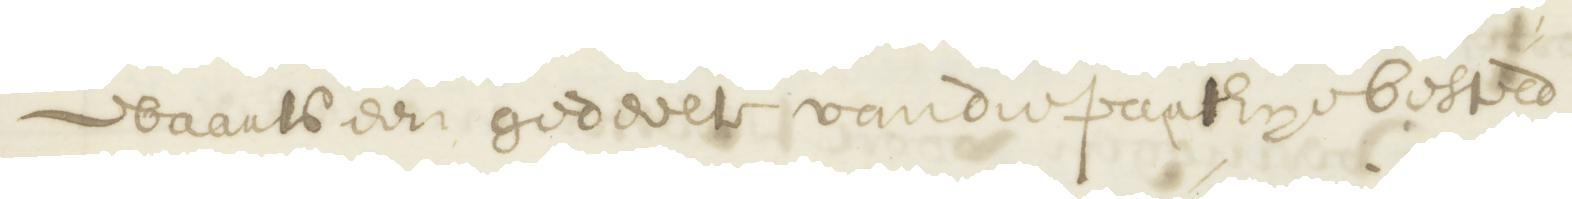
waarts een gedeelte van die parthije besteld
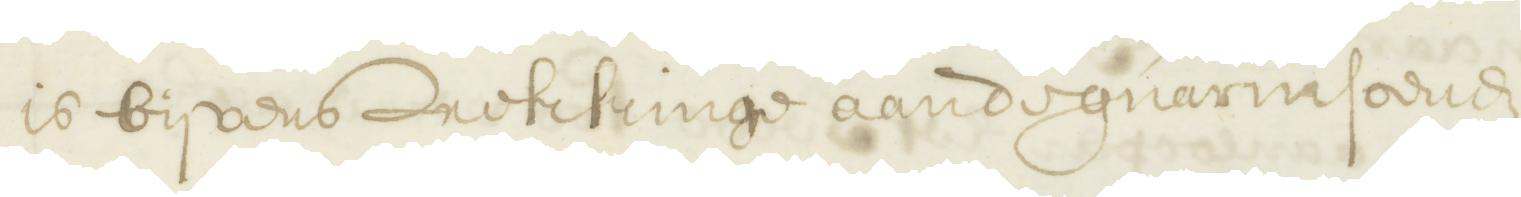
is bij verstrekkinge aan de guarnisoenen
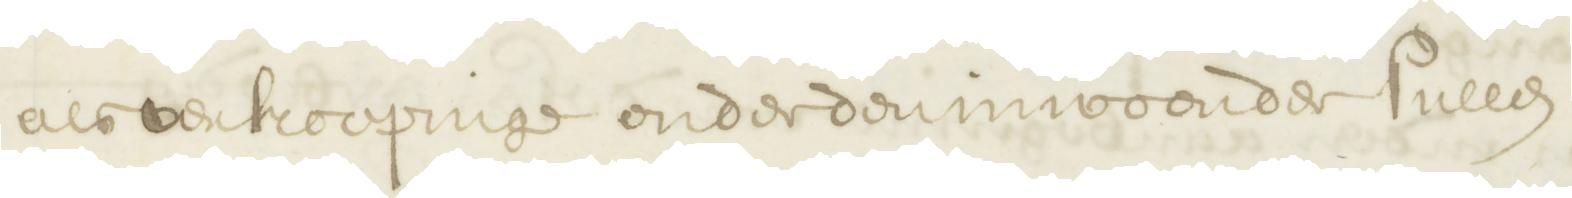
als verkoopinge onder den inwoonder sullen
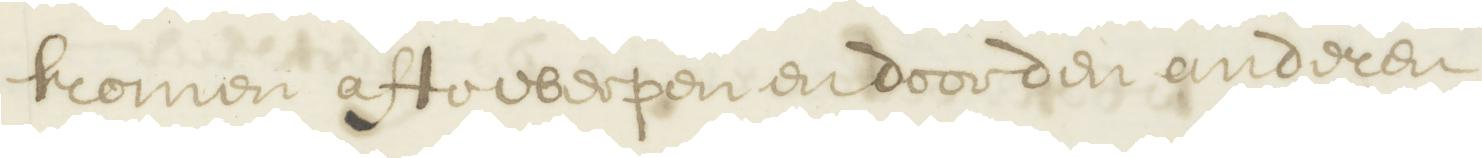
komen afte werpen en door den anderen
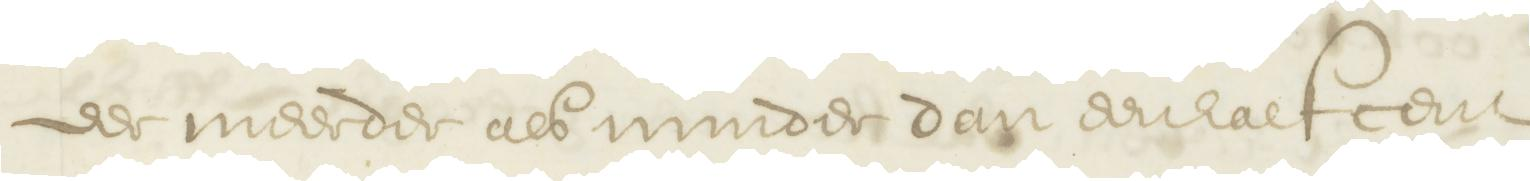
eer meerder als minder dan een half cent
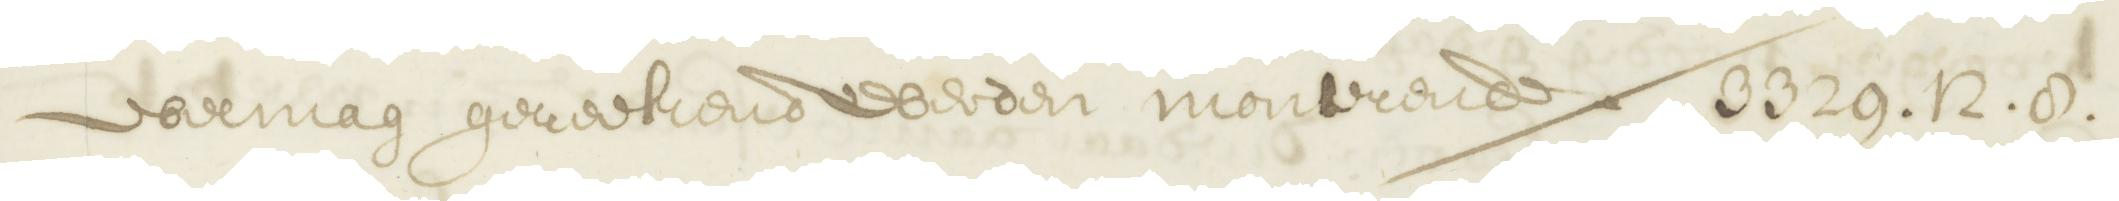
wel mag gereekend werden monterende ƒ 3329.12.8.
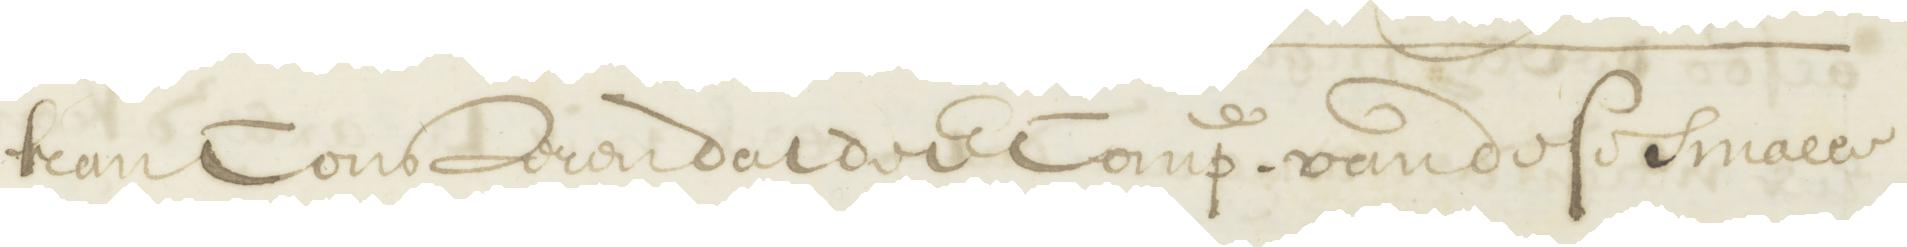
kan Consteren dat de E Comp.e van dese smalle
